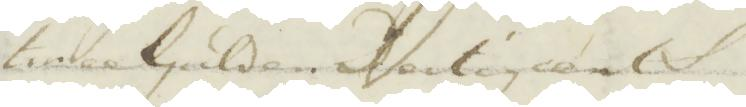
twee Gulden Dertig cents
